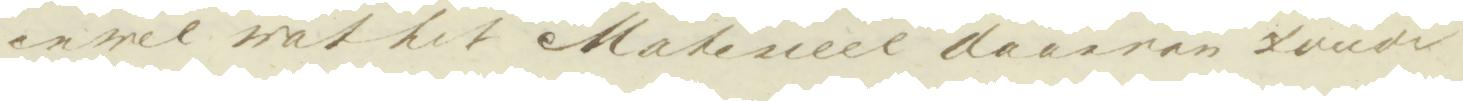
en wel wat het Materieel daarvan zoude
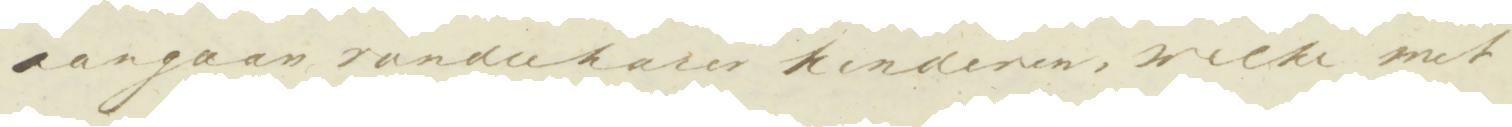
aangaan van die harer kinderen, welke met
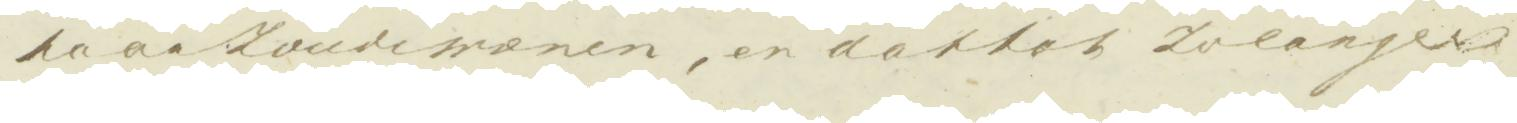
haar zoude wonen, en dat tot zolanger
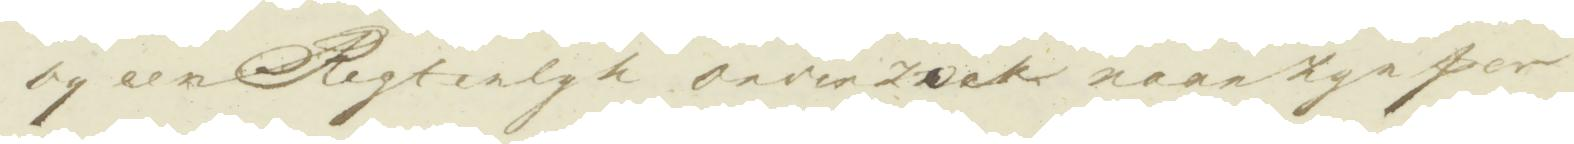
by een Regterlyk onder zoek naar zyn per
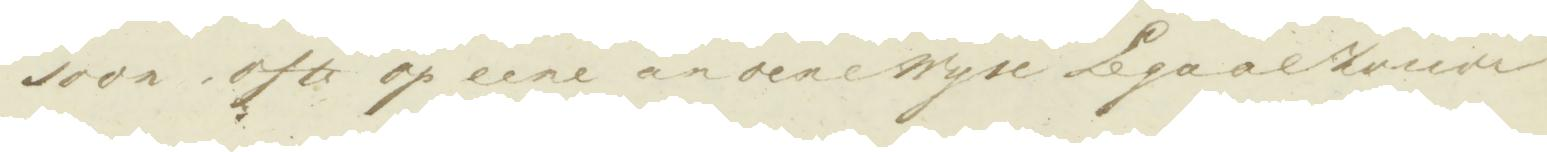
soon, ofte op eene andere wyse Legaal zoude
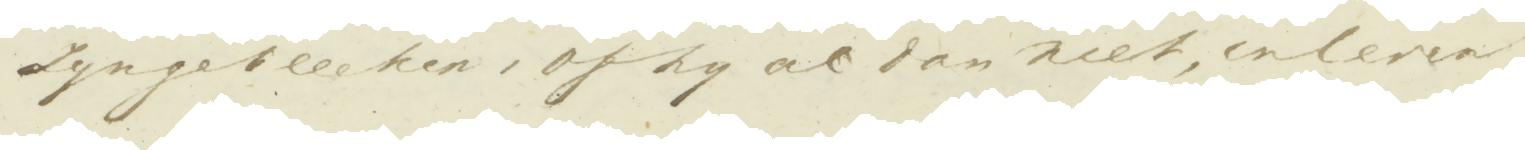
zyn gebleeken, of hy al dan niet, in leven
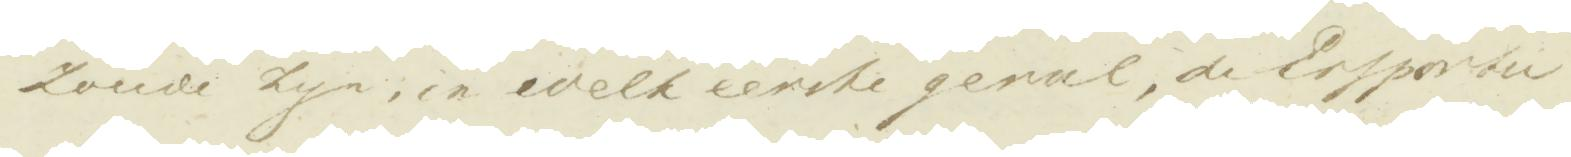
zoude zyn, in welk eerste geval, de Erfportie
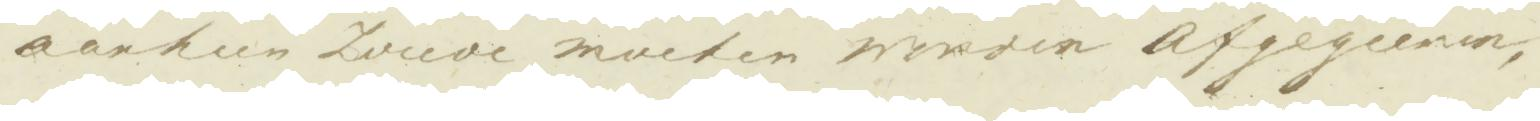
aan hun zoude moeten worden afgegeeven,
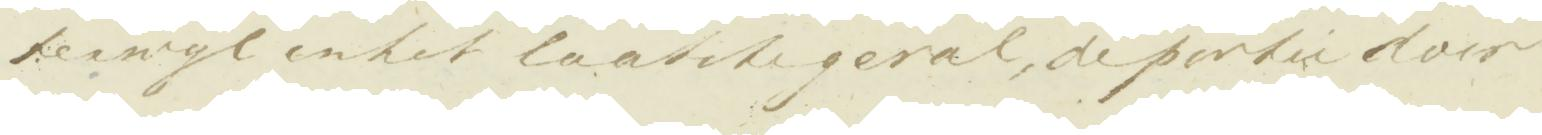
terwyl in het laatste geval, de portie door
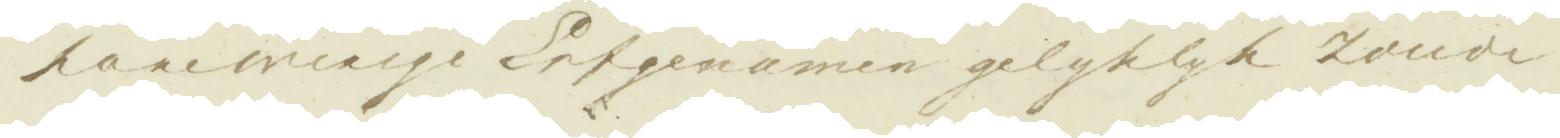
hare overige Erfgenamen gelyklyk zoude
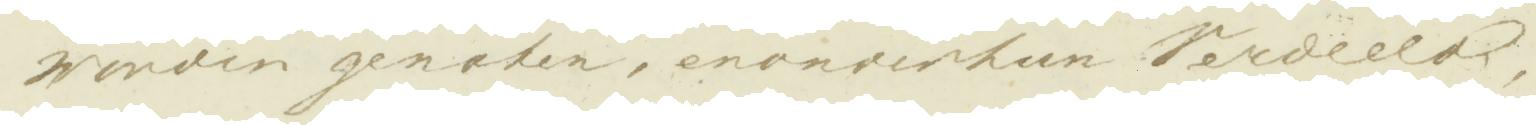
worden genoten, en onder hun Verdeeld,
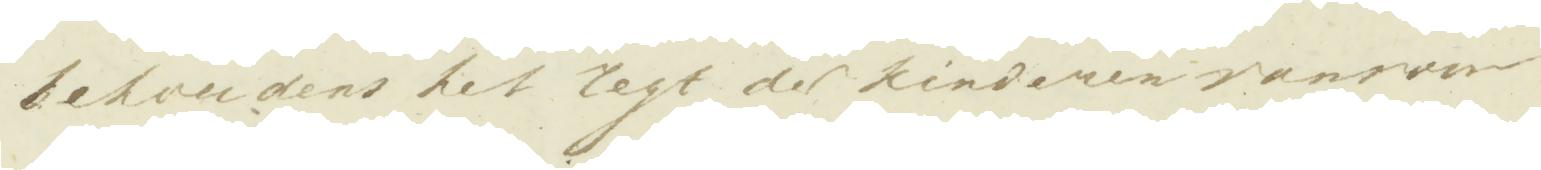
behoudens het regt de kinderen van voor
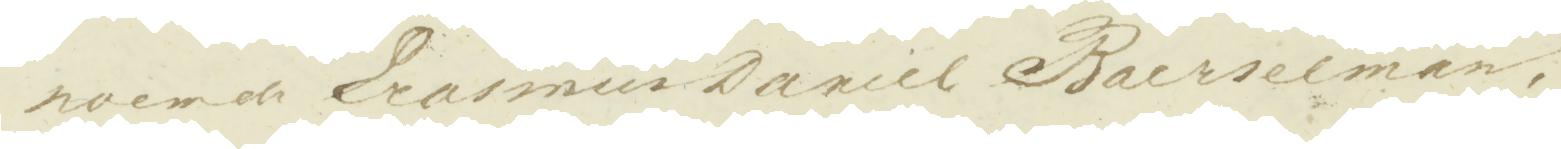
noemde Erasmus Daniel Baerselman,
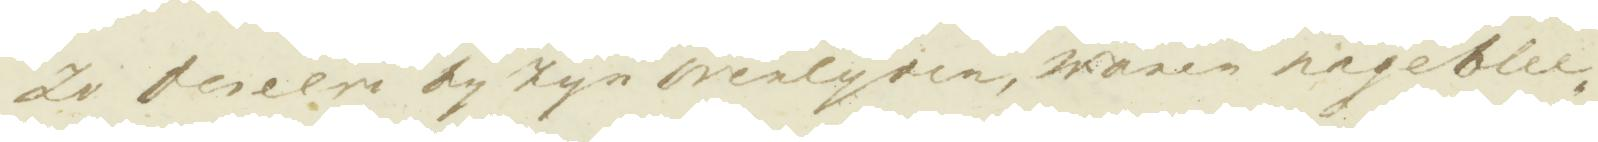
zo deselve by zyn overlyden, waren nageblee„
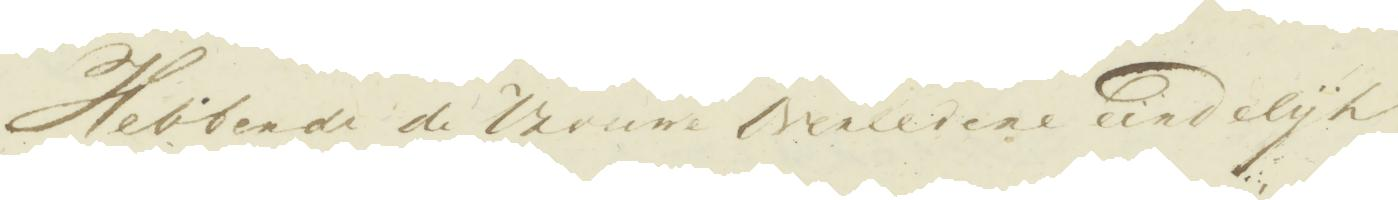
Hebbende de Vrouwe Overledene eindelijk
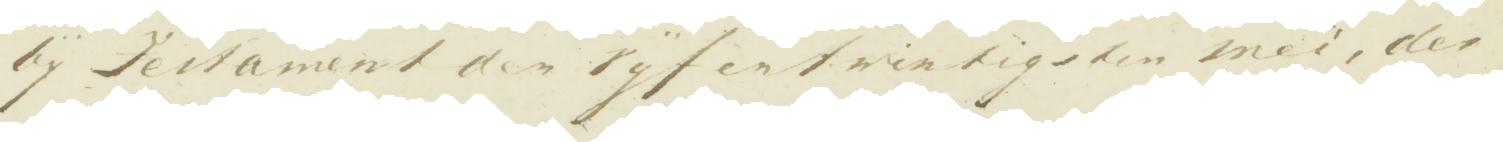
bij Testament den Vijf en twintigsten mei, des
